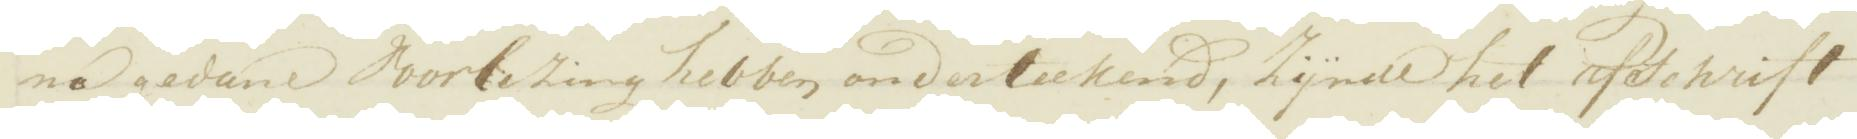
na gedane Voorlezing hebben onderteekend, Zijnde het afschrift
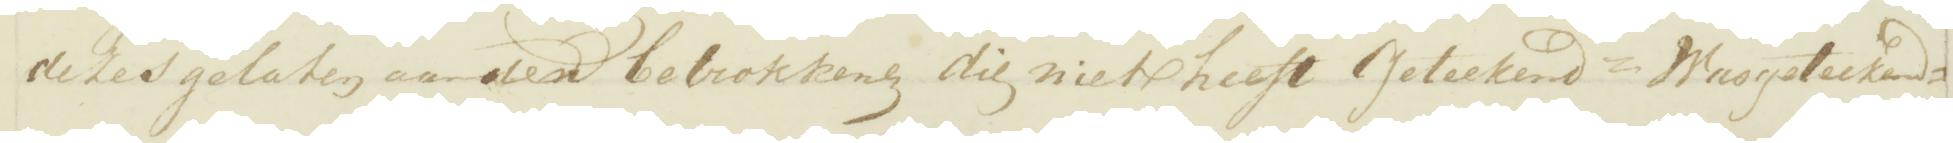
dezes gelaten aan den betrokkenen die niet heeft geteekend= Was geteekend=
